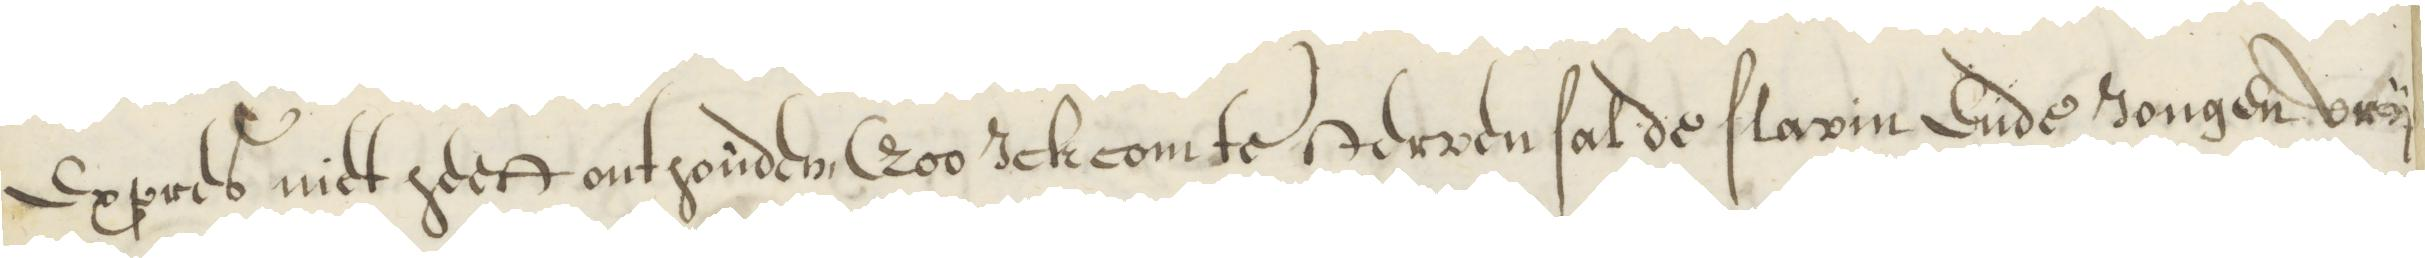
Expres niet heeft onthouden, (zoo Ick com te sterven sal de slavin ende Iongen vrij
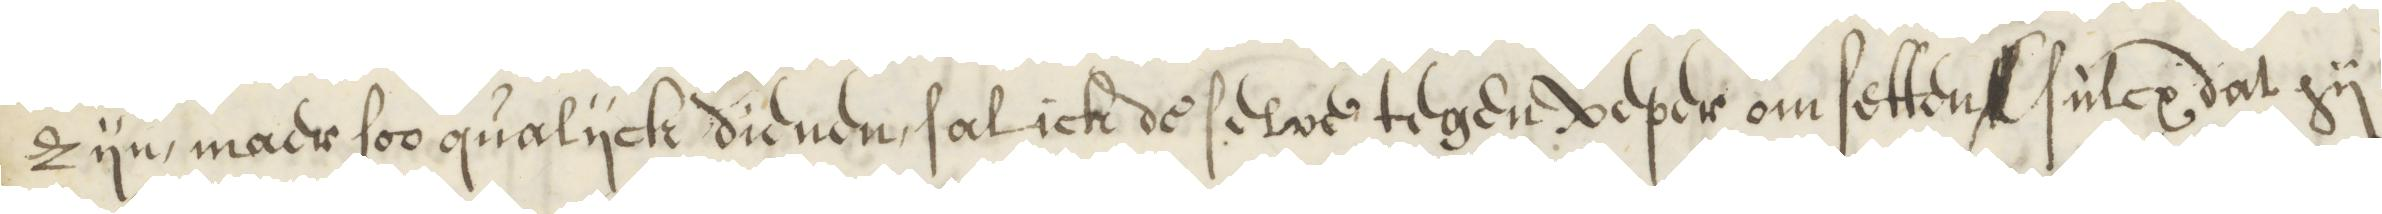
zijn, maer soo qualijck dienen, sal ick de selve tegen peper om setten s sulcx dat hij
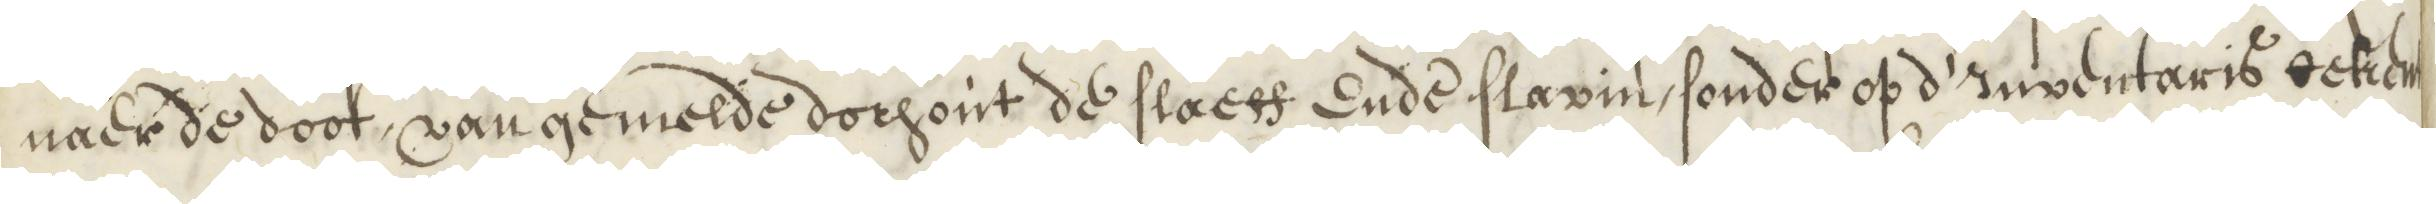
naer de doot, van gemelde dorhout de slaeff ende slavin, sonder op d’ Inventaris reken
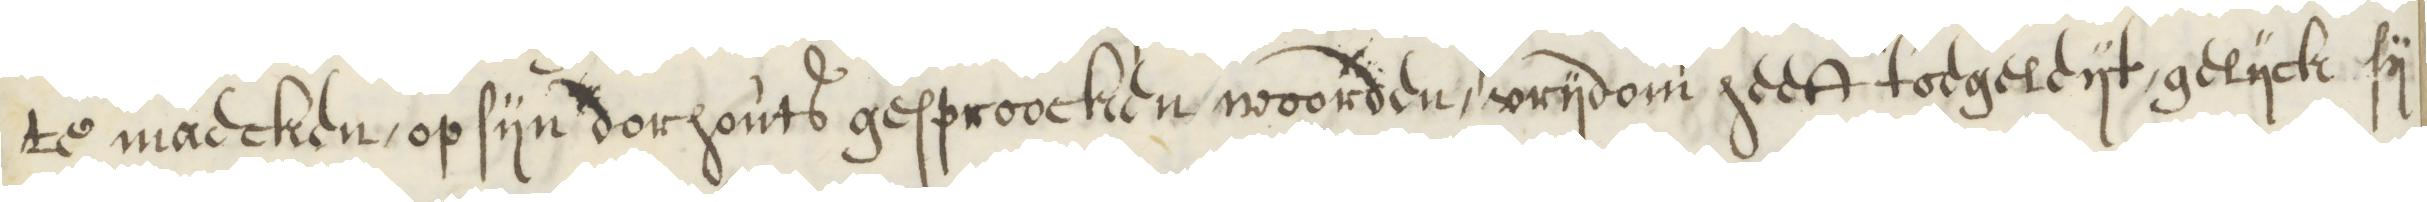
te maecken, op sijn dorhouts gesproocken woorden, vrijdom heeft toegeleijt, gelijck sij
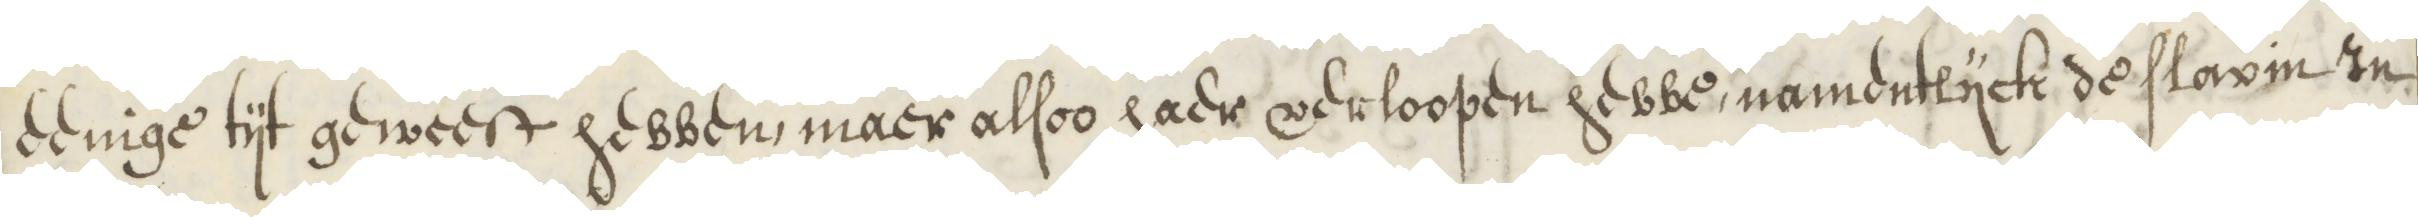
eenige tijt geweest hebben, maer alsoo haer verloopen hebbe, namentlijck de slavin In
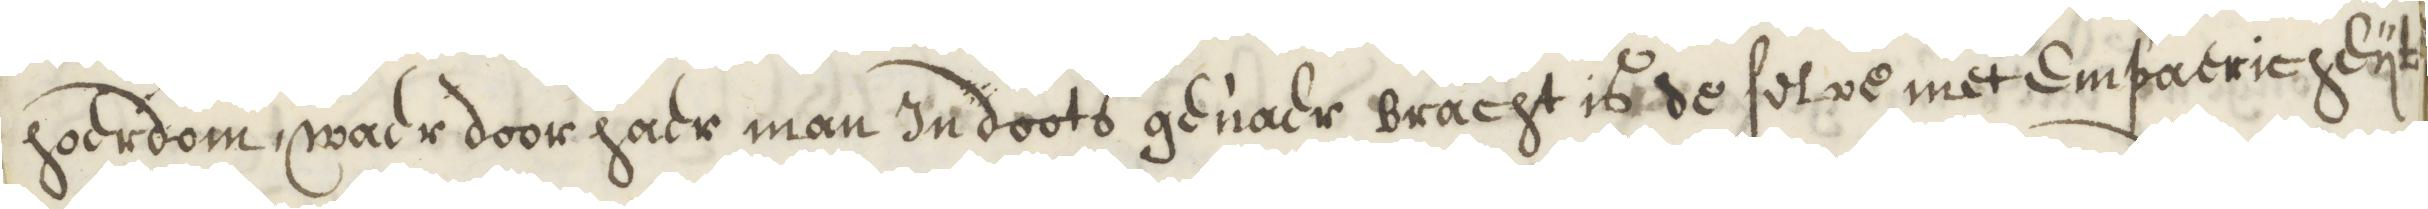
hoerdom, waer door haer man Indoots gevaer bracht is de selve met empaericheijt
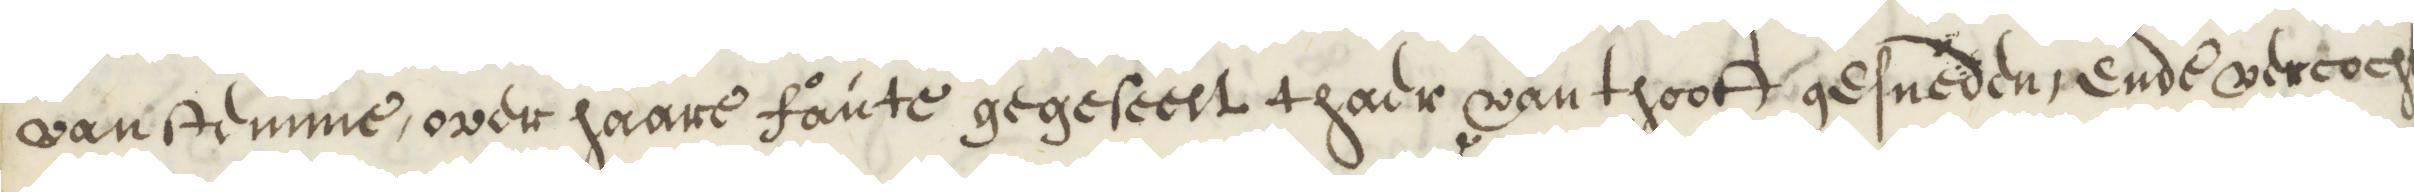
van stemme, over haare faute gegeseelt thaer van thooft gesneden, ende vercocht
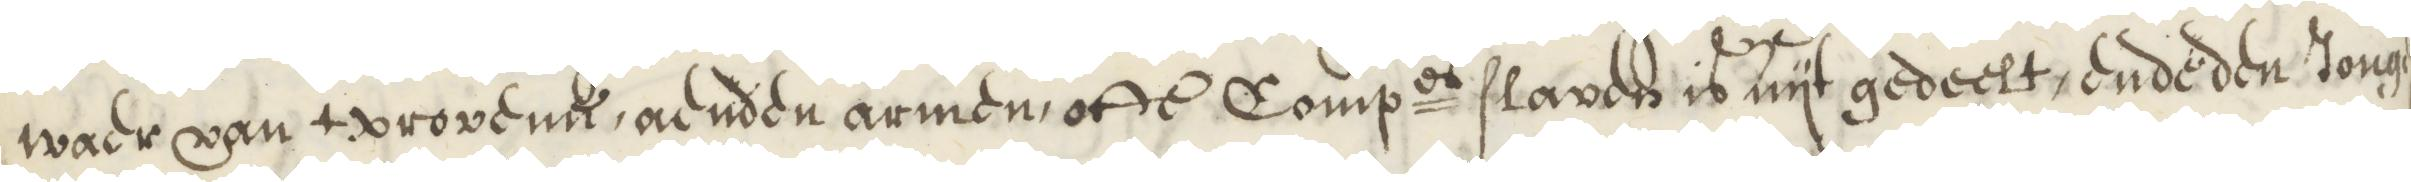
waer van t provenu, aenden armen, ofte Comp=es slaven is uijt gedeelt, ende den Iong
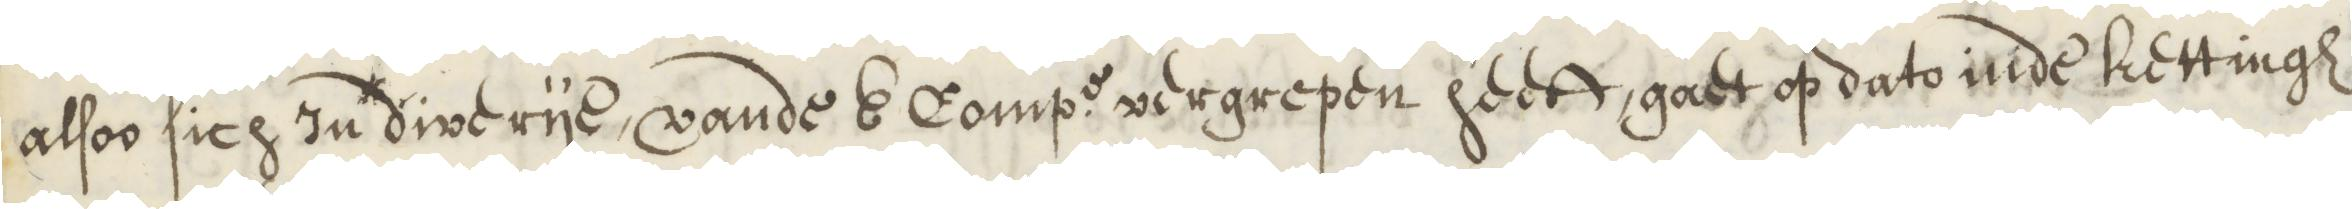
alsoo sich In diverije, vande E Comp:e vergrepen heeft, gaet op dato inde kettingh
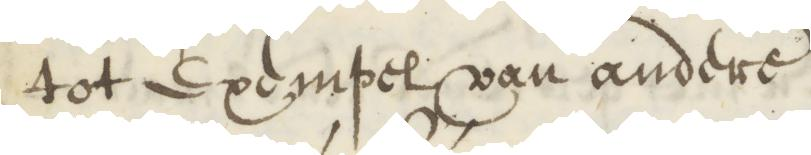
tot Exempel van andere
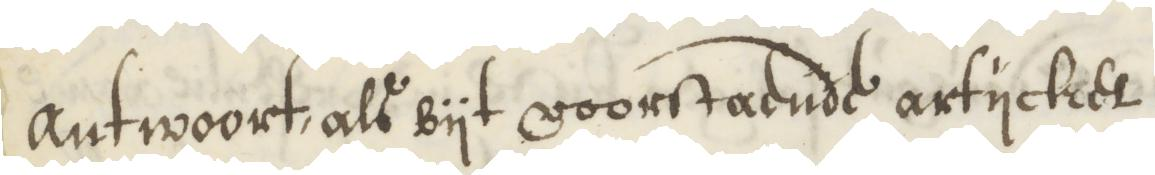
Antwoort, als bijt voorstaende artijckel
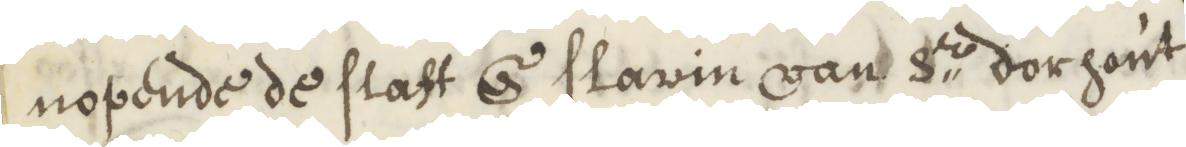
nopende de slaff ende slavin van s„r dorhout
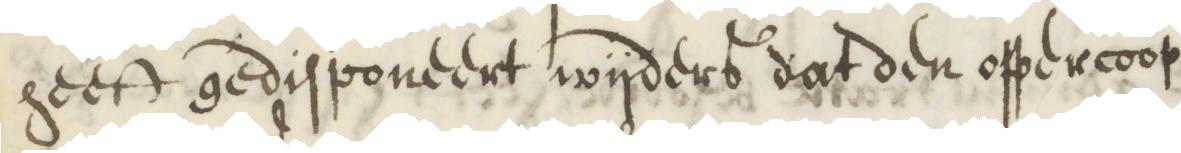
heeft gedisponeert wijders dat den oppercoop
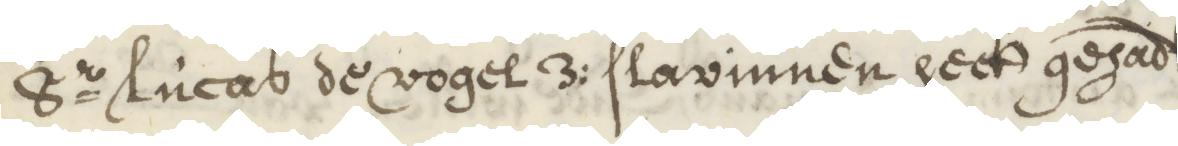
s=r lucas de vogel 3: slavinnen heeft gehadt
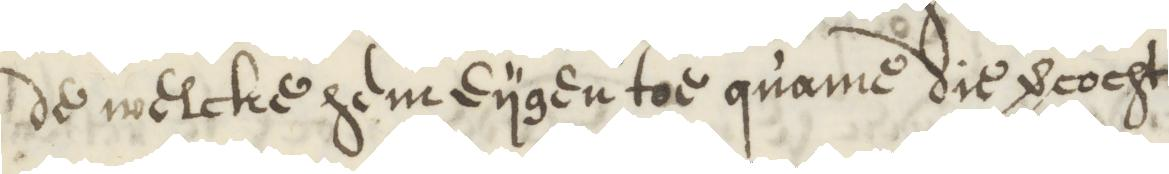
de welcke hem Eijgen toe quame die vercocht
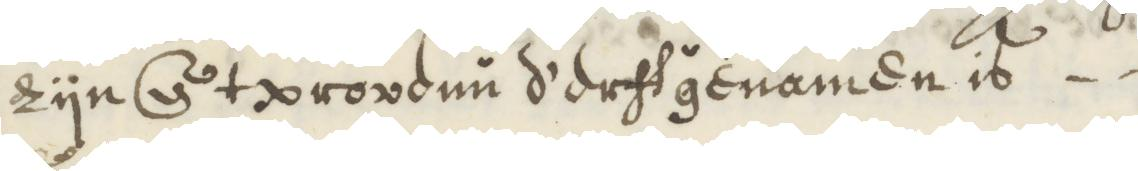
zijn ende t provenu d’ erff genamen is —
